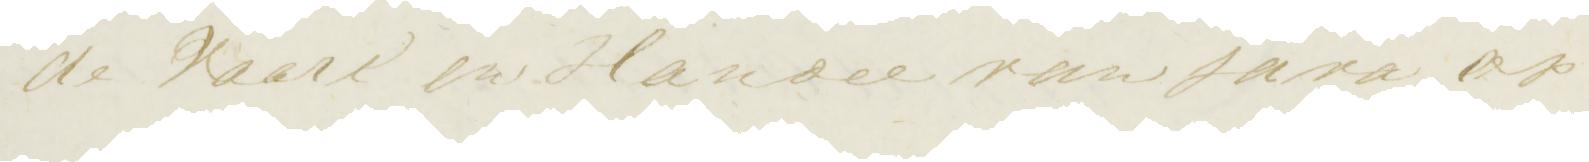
de Vaart en Handel van Java op
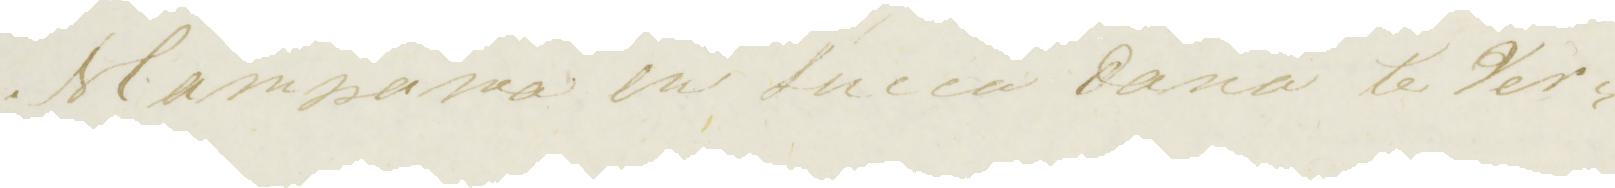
Mampawa en Lucca dana te Ver„
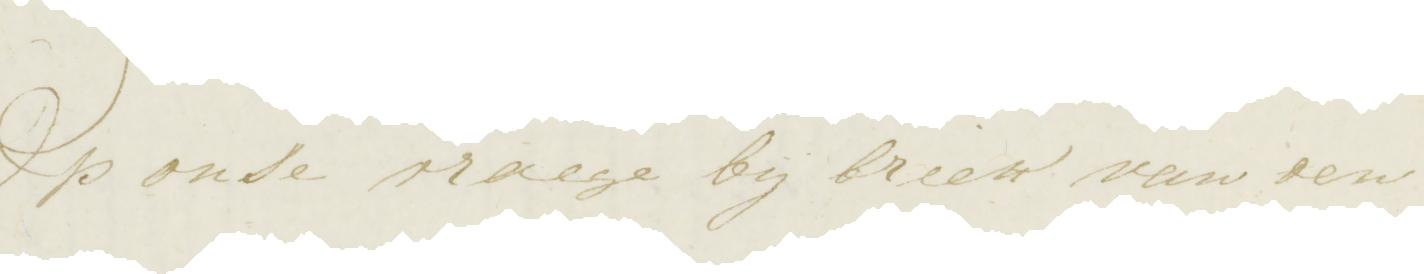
Op onse vraege bij briev van den
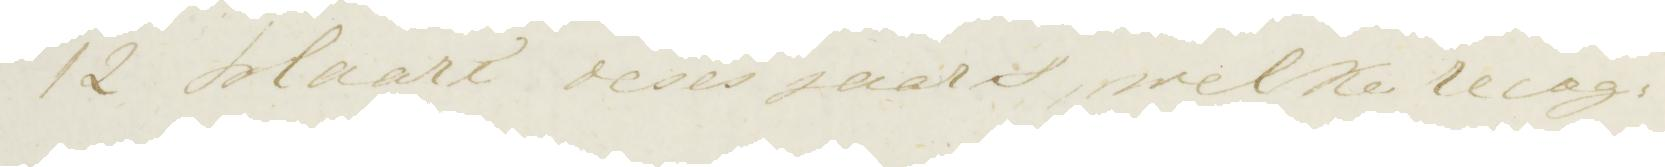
12 Maart deses jaars, welke recog„
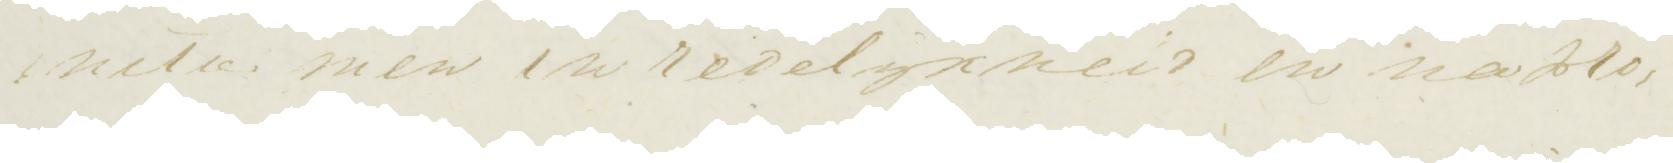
„nitie men in redelijkheid en na pro„
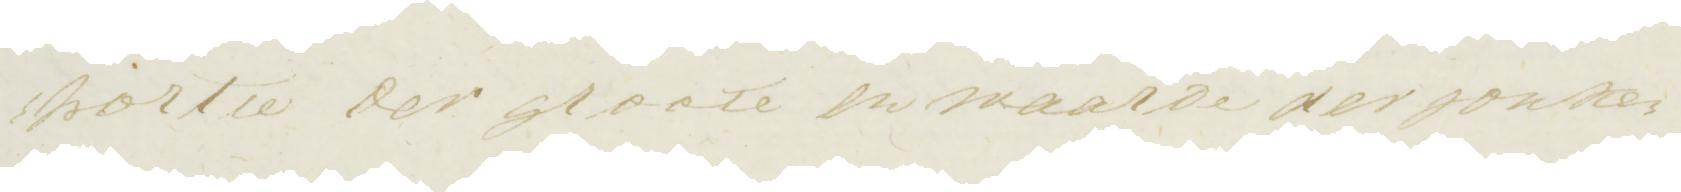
„portie der groote en waarde der jonken
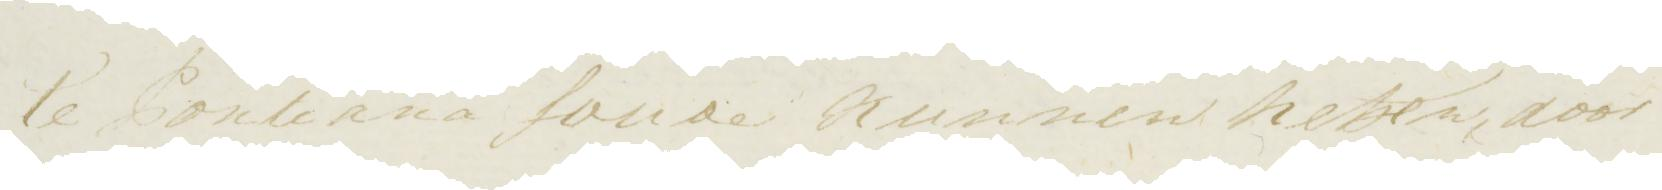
te Pontiana soude kunnen heffen, door
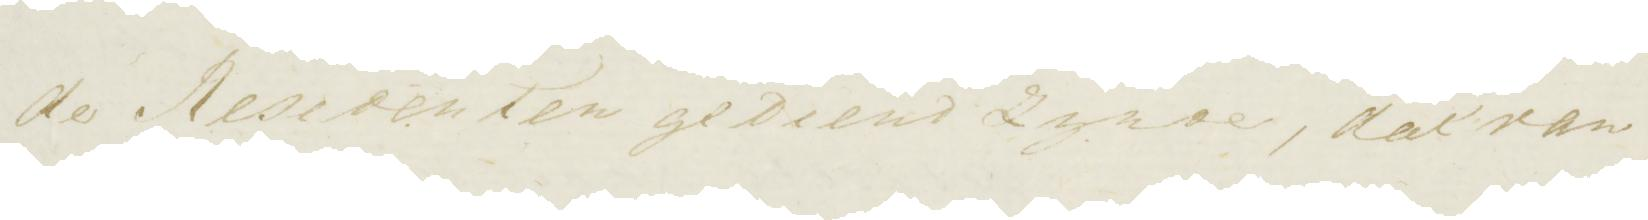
de Residenten gediend zijnde, dat van
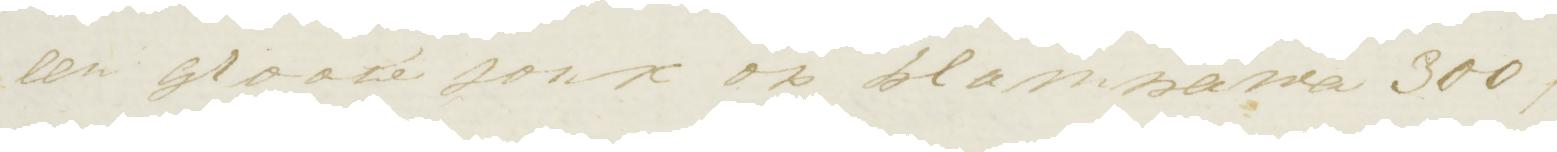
een groote jonk op klampawa 300,
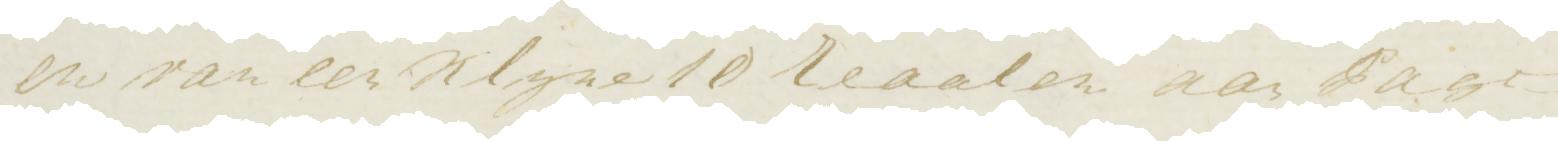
en van een klijne 10 Reaalen aan Pagt
